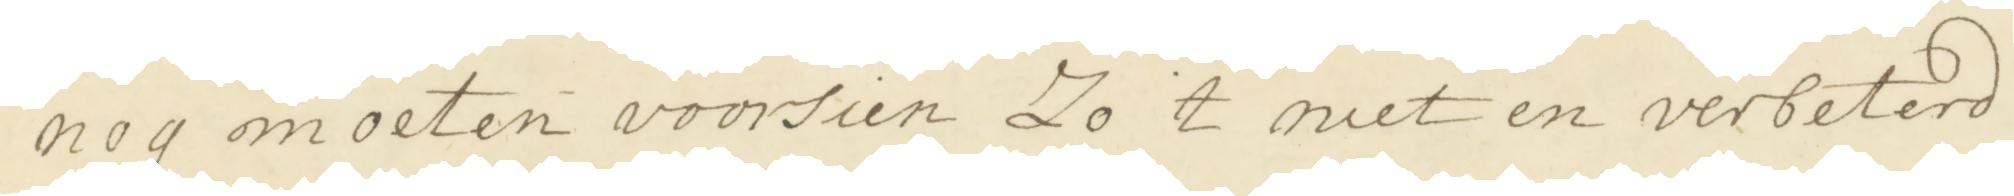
nog moeten voorsien zo 't niet en verbeterd
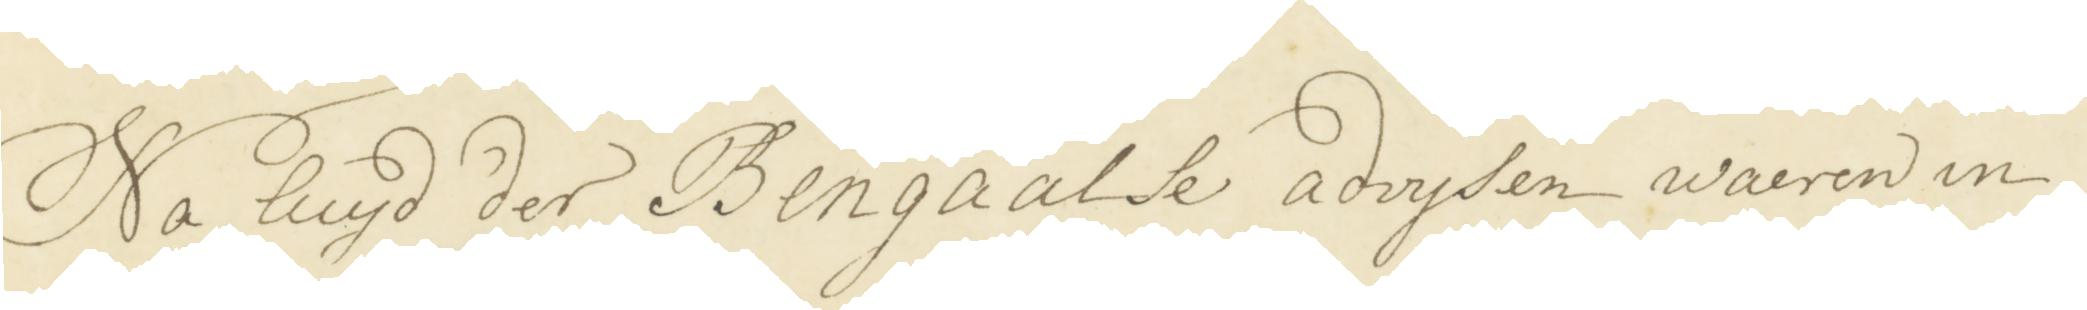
Na luyd der Bengaalse advysen waeren in
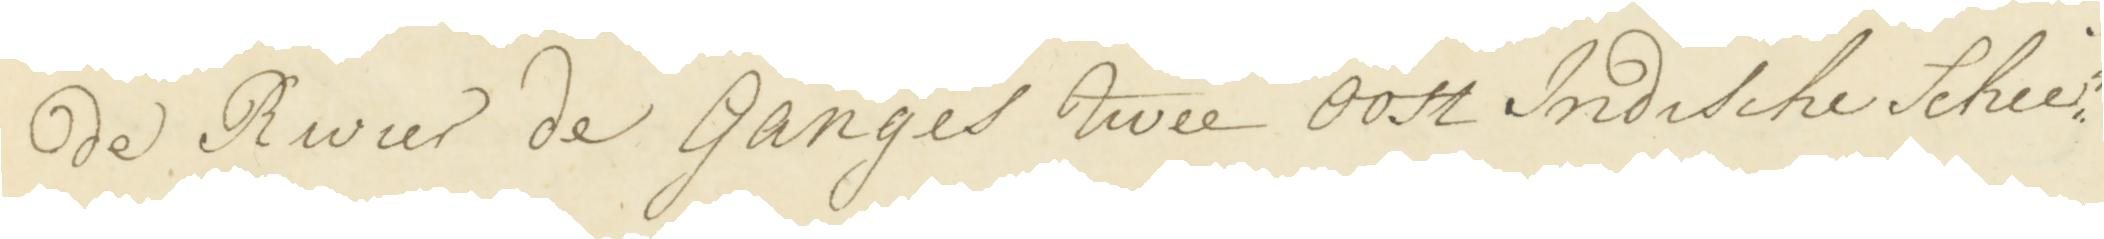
de Rivier de Ganges twee Oost Indische schee„
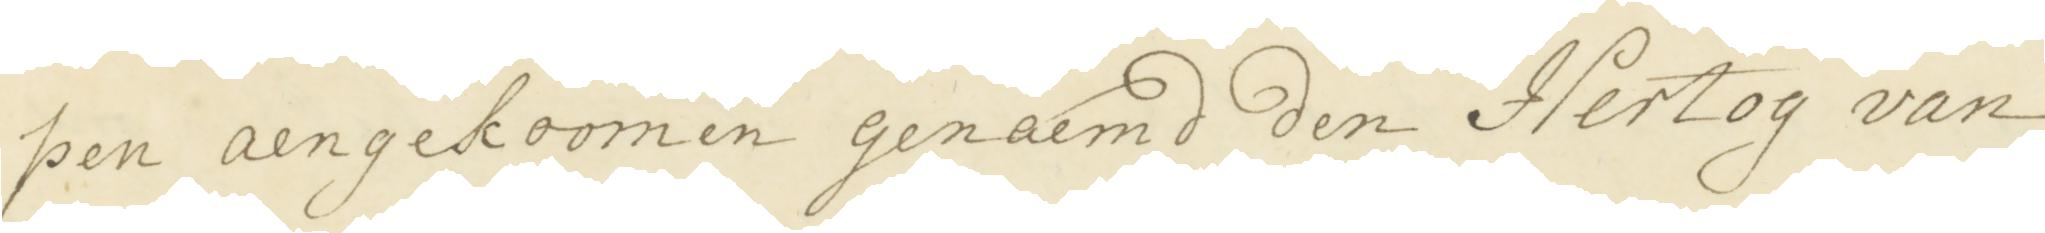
pen aengekoomen genaemd den Hertog van
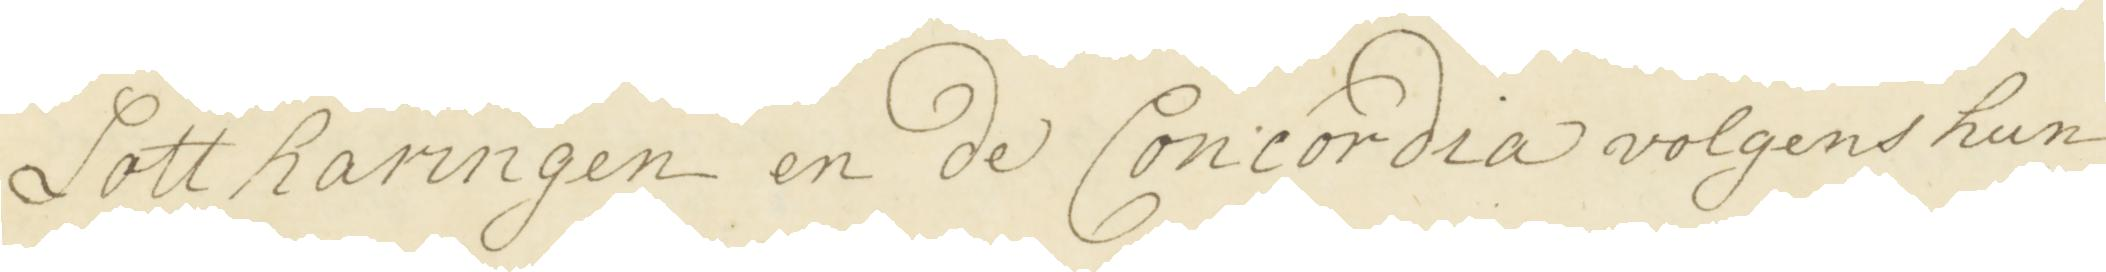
Lottharingen en de Concordia volgens hun
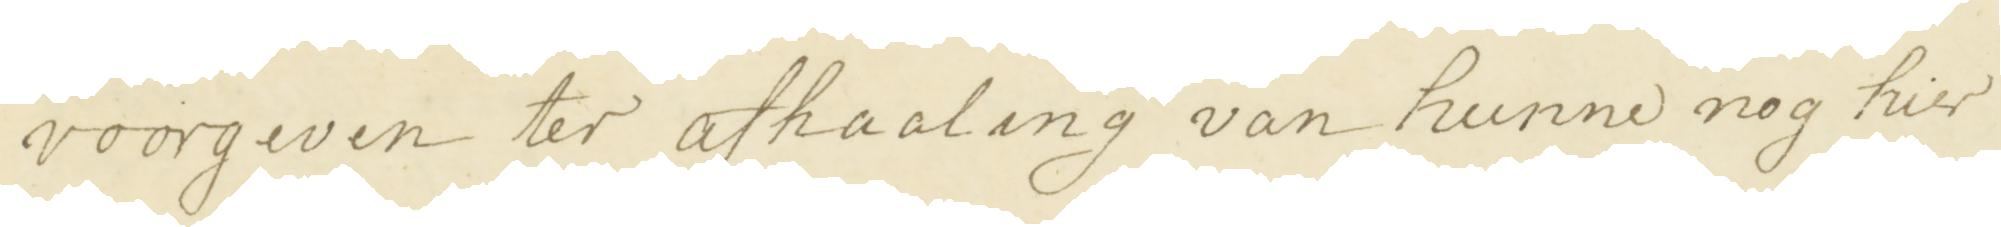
voorgeven ter afhaaling van hunne nog hier
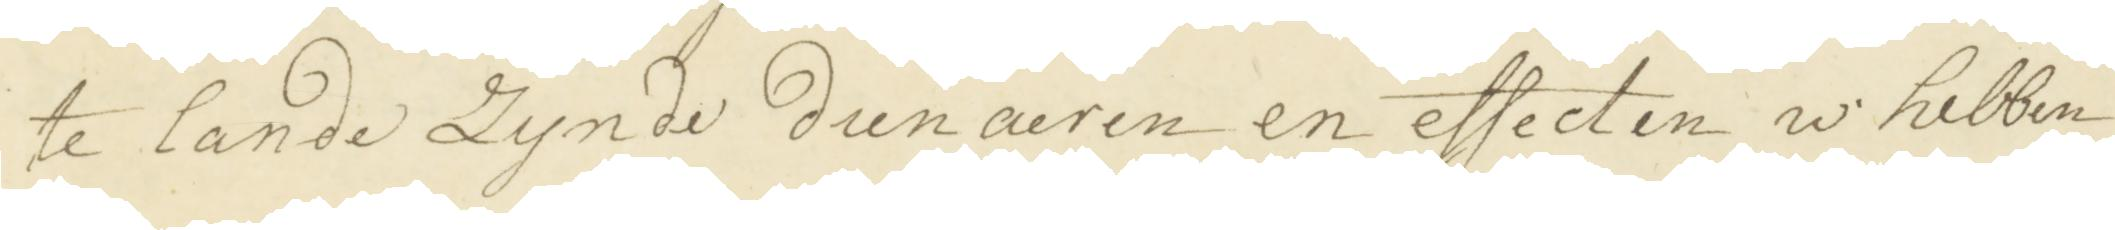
te lande zynde dienaeren en effecten w' hebben
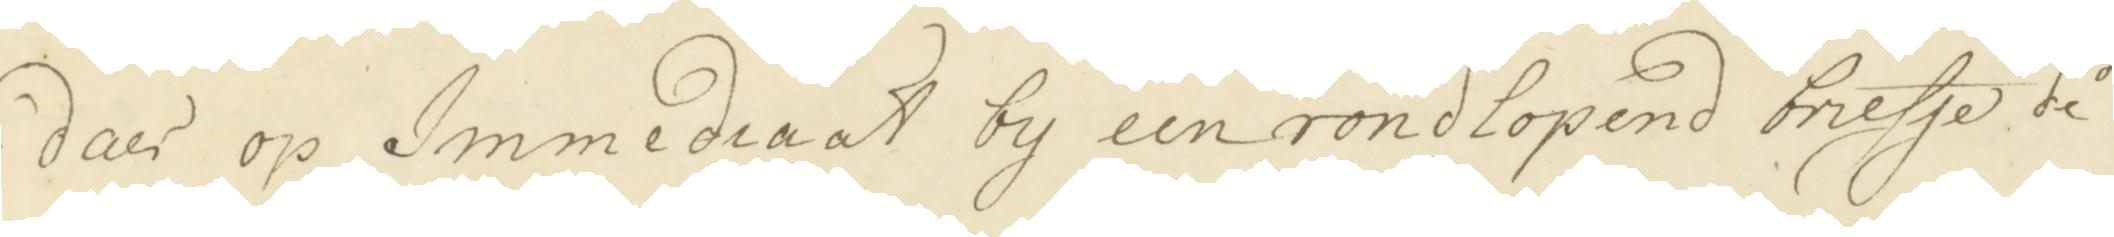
daer op Immediaat by een rondlopend briefje de
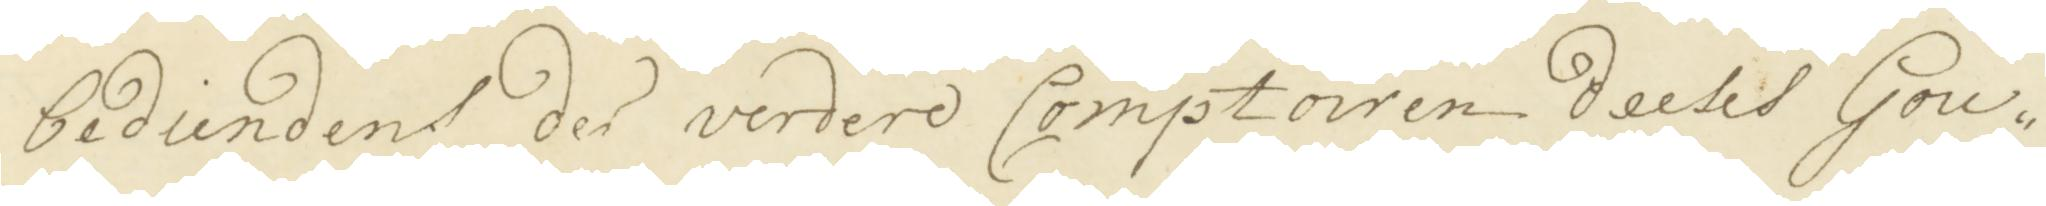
bediendens der verdere Comptoiren deeses Gou„
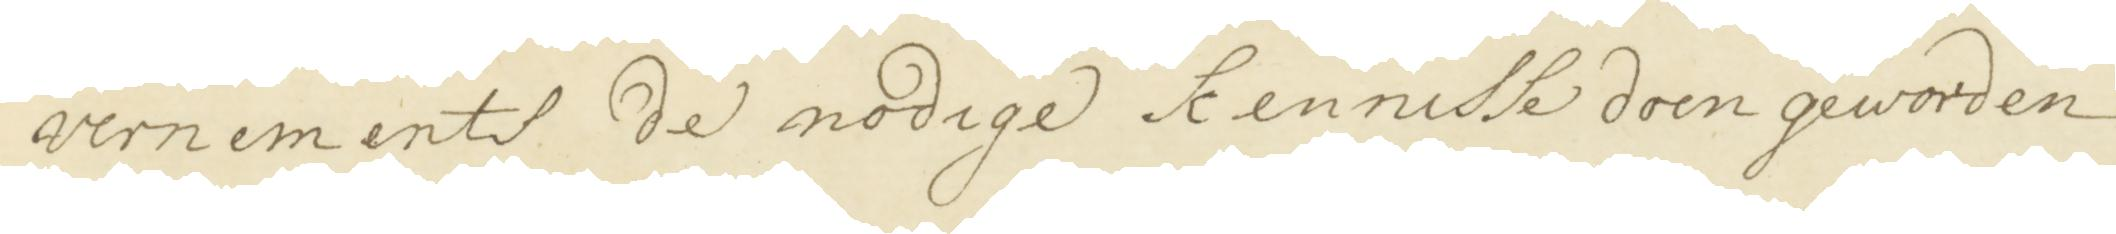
vernements de nodige kennisse doen geworden
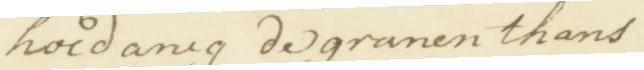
hoedanig de granen thans
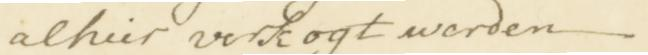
alhier verkogt werden
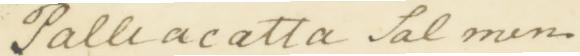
Palliacatta sal men
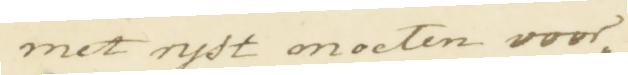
met ryst moeten voor„
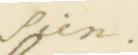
sien.
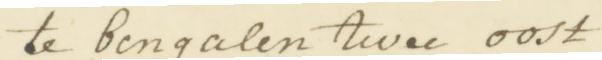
te bengalen twee oost
